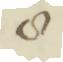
,, 8
